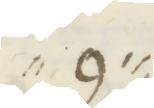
" 9 "
